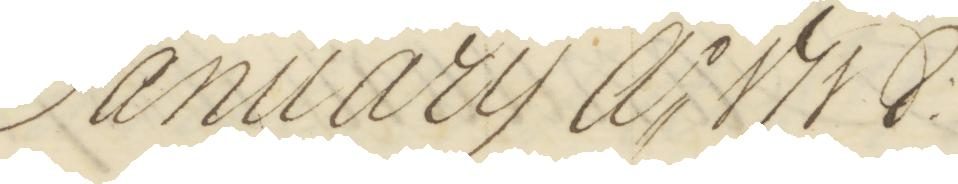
Januarij A„o 1718:
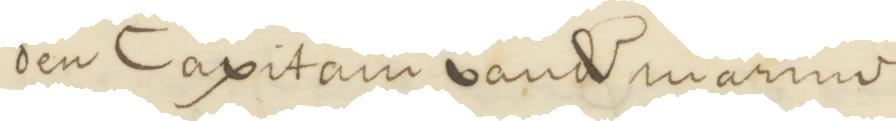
den Capitain vande marine
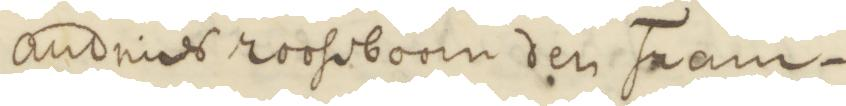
Andries rooseboom den Train-
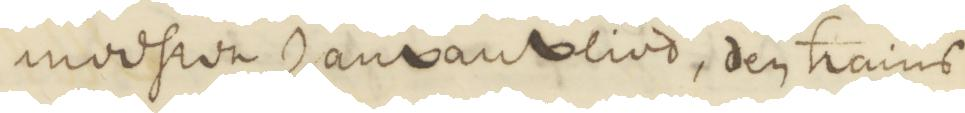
meester Jan van vlied, den trains
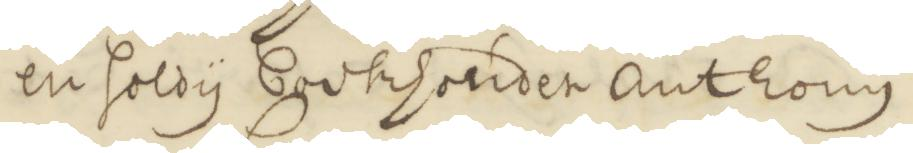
en soldij boekhouder Anthonij
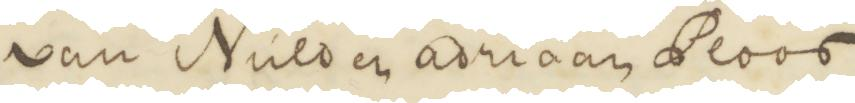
van Nuld en Adiaan Ploos
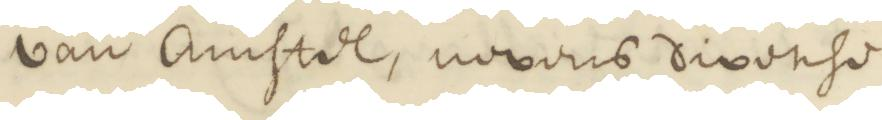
van Amstel, nevens diverse
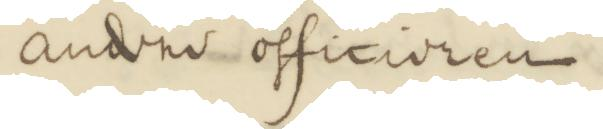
andere officieren.
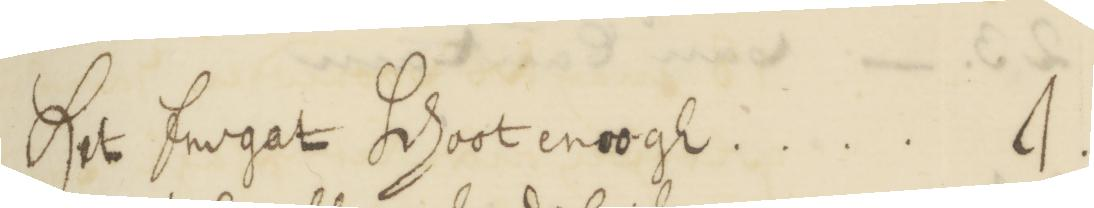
Het fregat schoot en oogh 4.
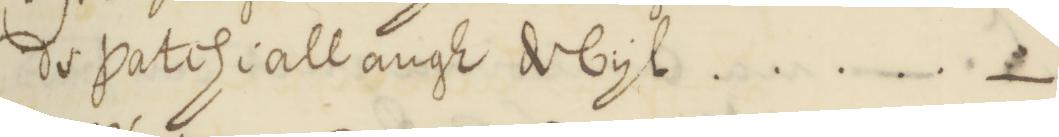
de patchiallangh de bijl
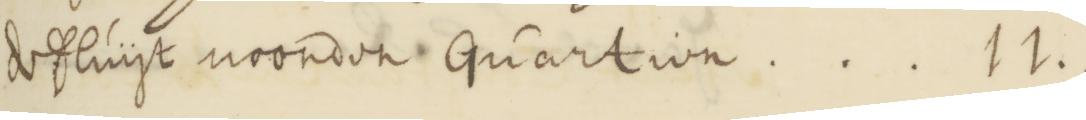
de fluijt noorder Quartier. 11.
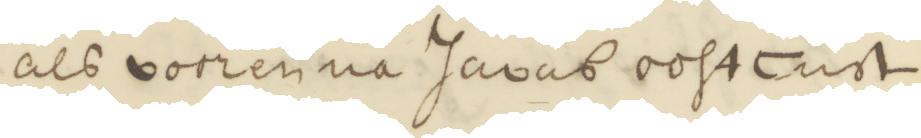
als vooren na Javas oost cust
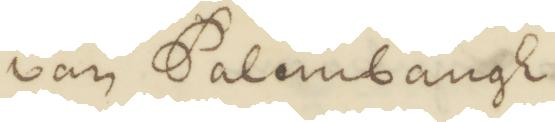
van Palembangh
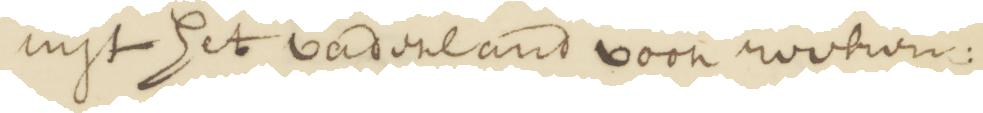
uijt het vaderland voor reeken:
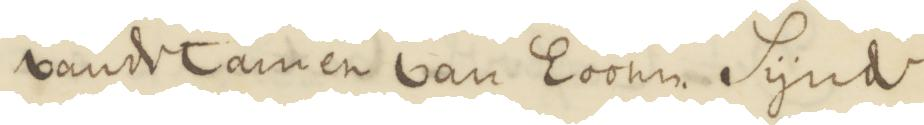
van de camer van hoorn. sijnde
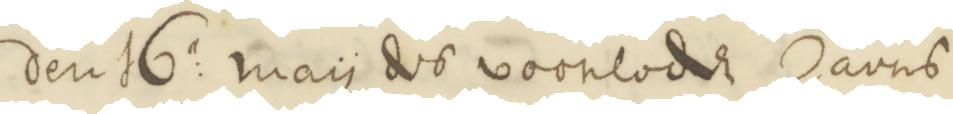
den 16:e maij des voorleden Jaers
